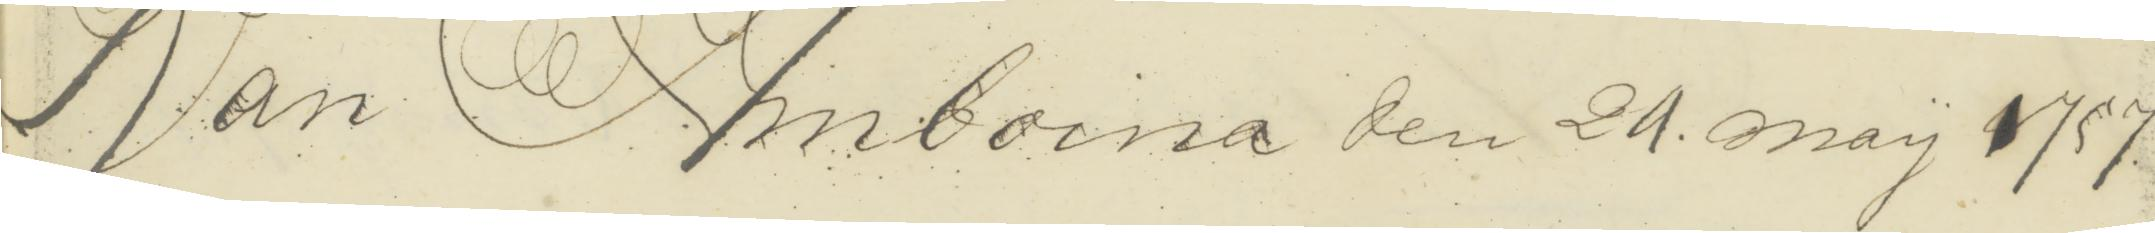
Van Amboina den 24. maij 1757
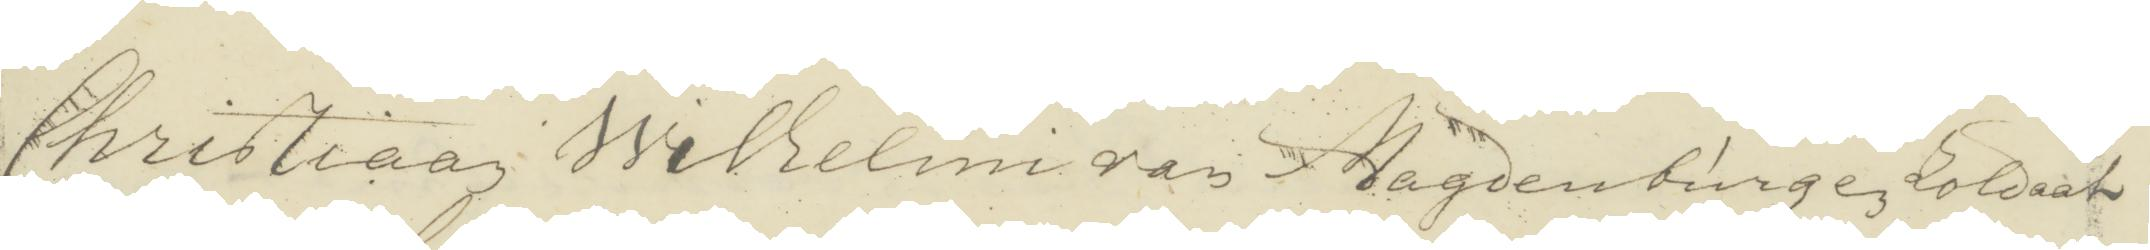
Christiaan Wilhelmi van Magdenburgen Zoldaat
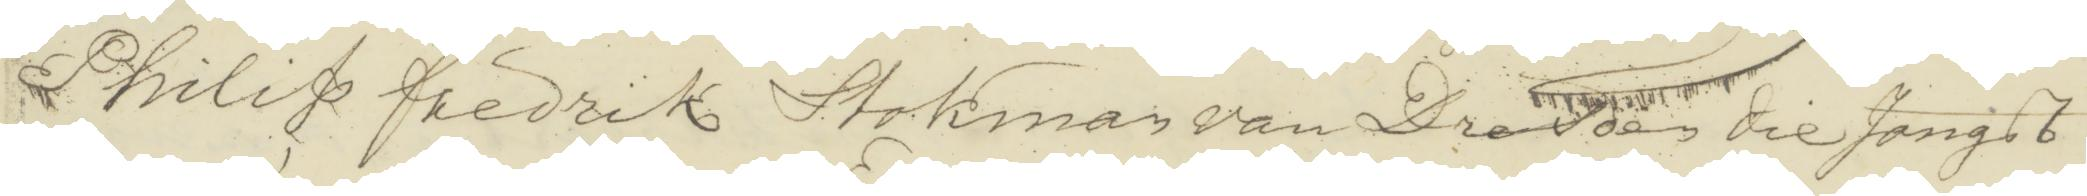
Philip fredrik Stokman van Drasoen die Jongst
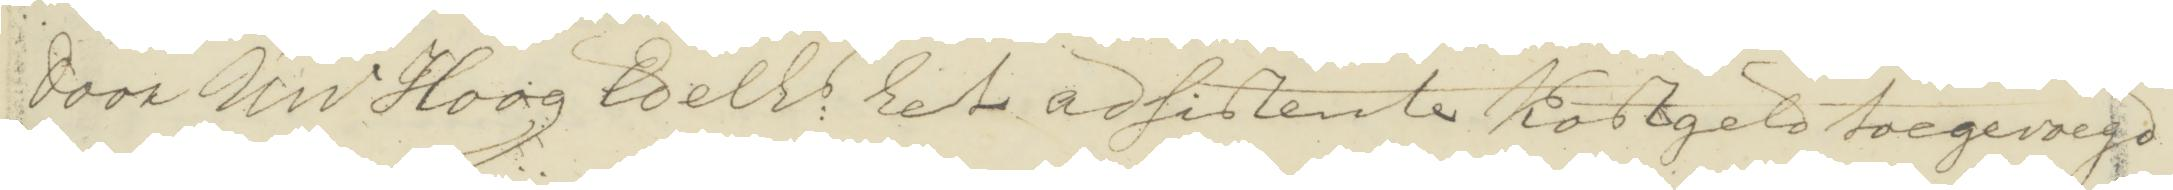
door uw Hoog Edelh:s het adsistente kostgeld toegevoegd
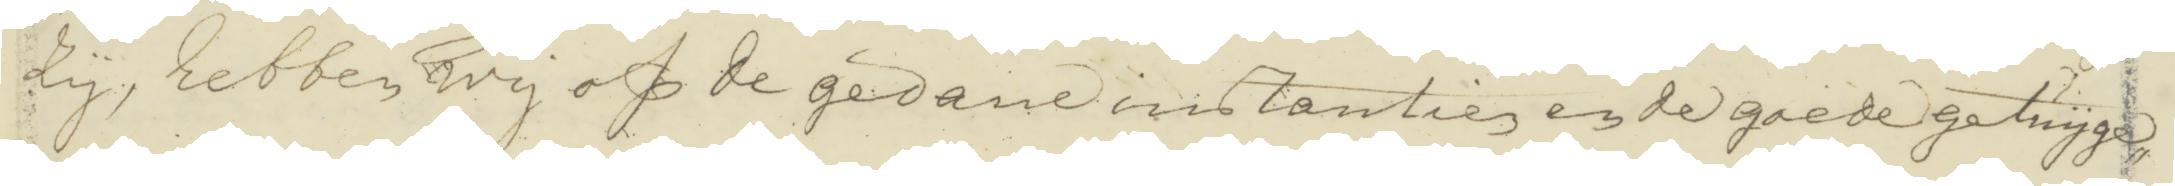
Zij, hebben wij op de gedane instantien en de goede getuijge„
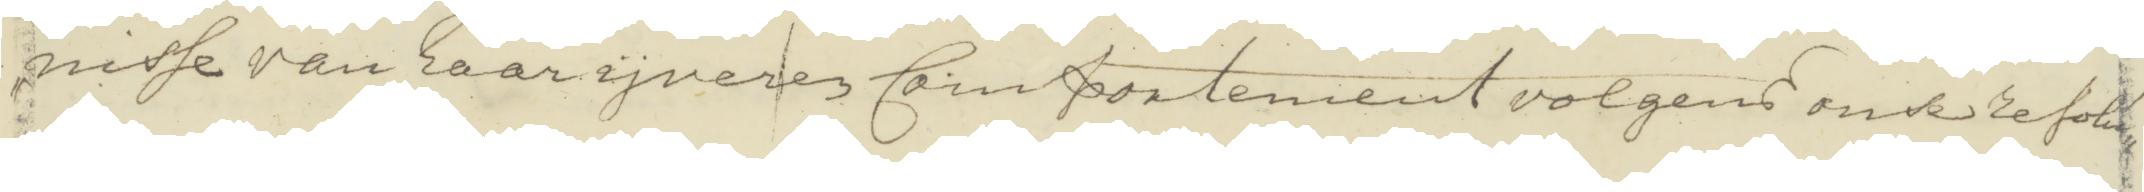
„nisse van haar ijveren Comportement volgens onse resolu„
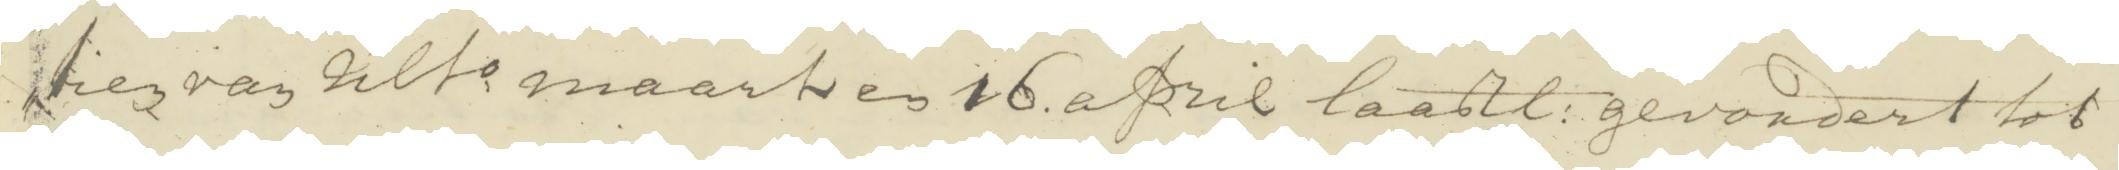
„tien van ult:o maart en 16. april laastl: gevordert tot
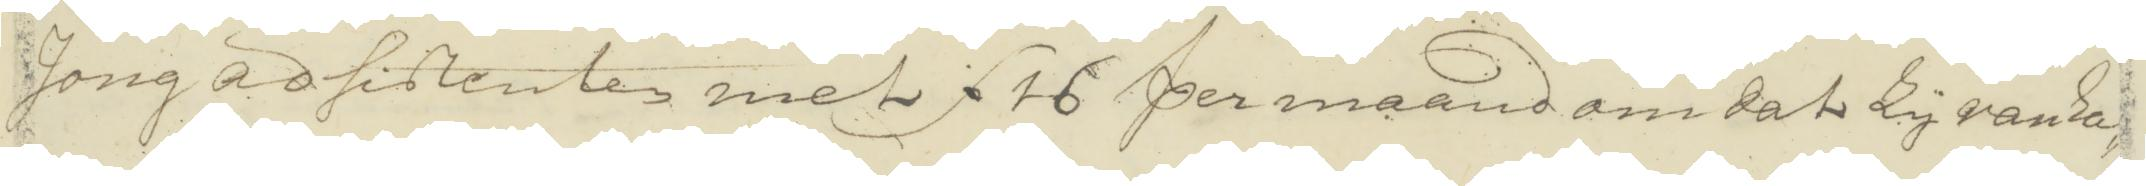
Jong adsistent en met ƒ 16 per maand om dat Zij van ha„
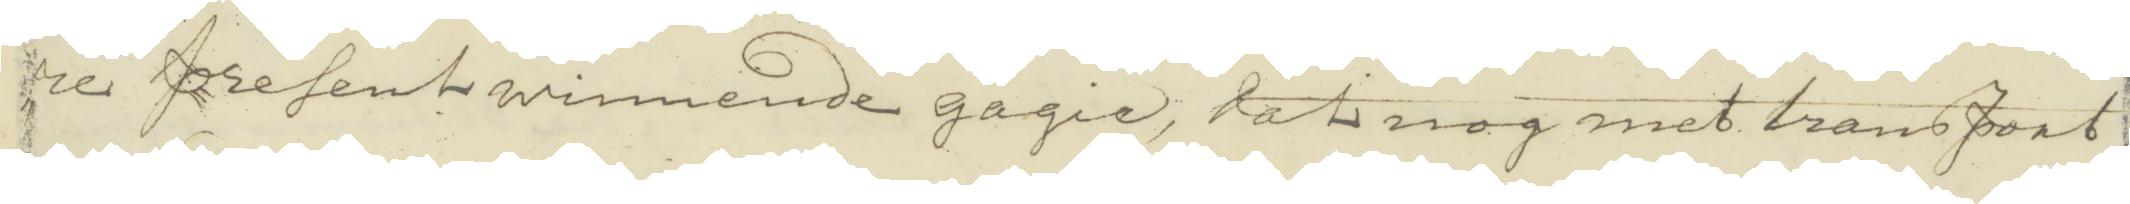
„re present winnende gagie, dat nog met transport
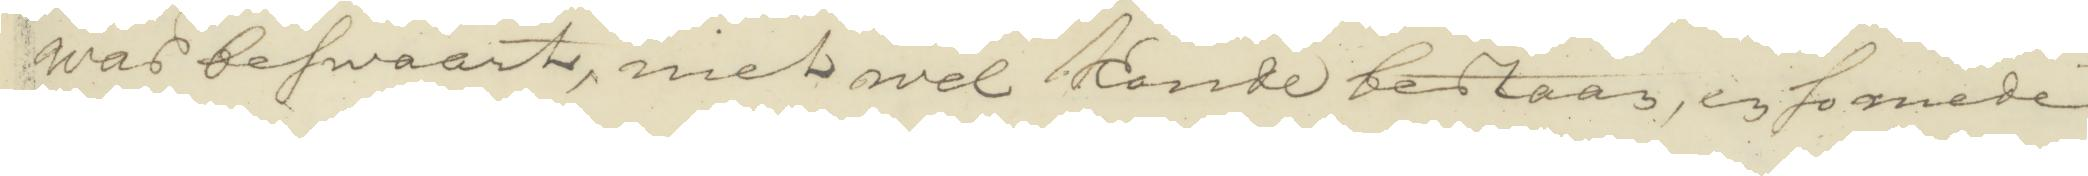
was beswaart, niet wel konde bestaan, en So mede
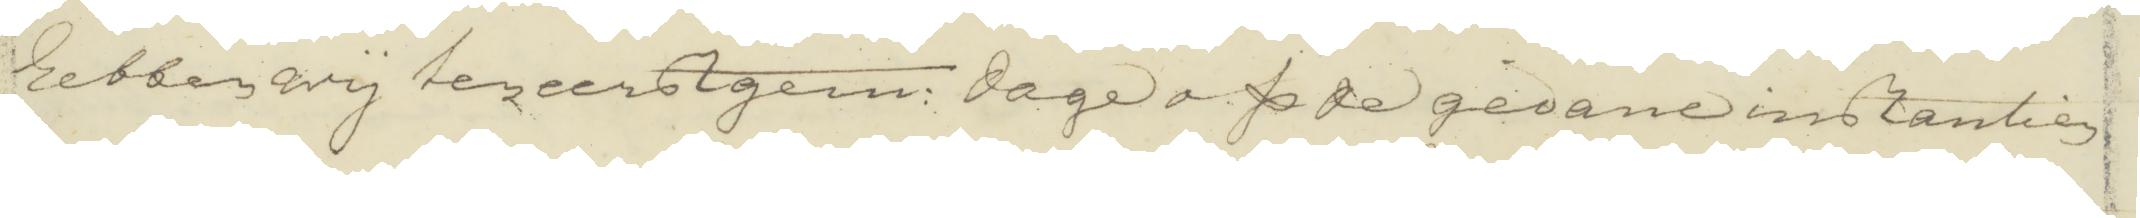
hebben wij ten eerstgem: dage op de gedane instantien
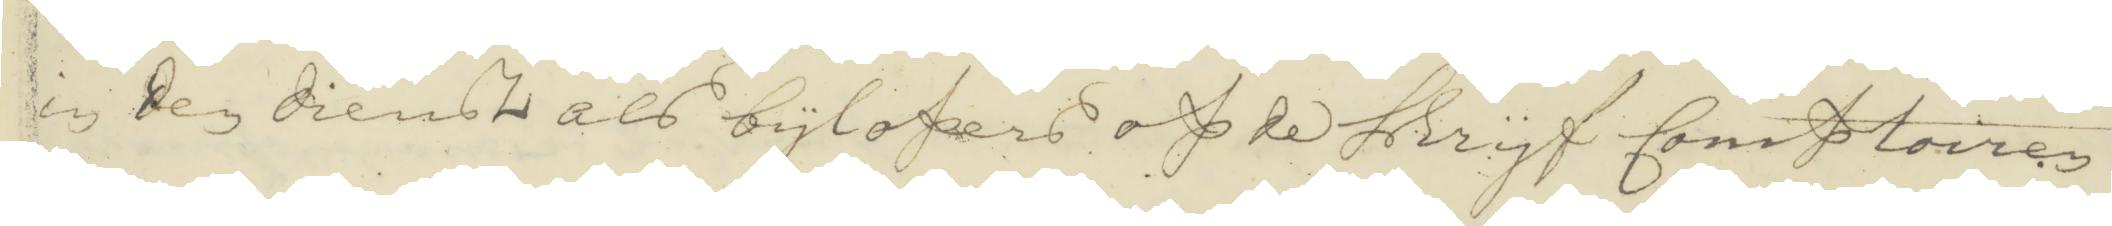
in den dienst als bij lopers op de schrijf Comptoiren
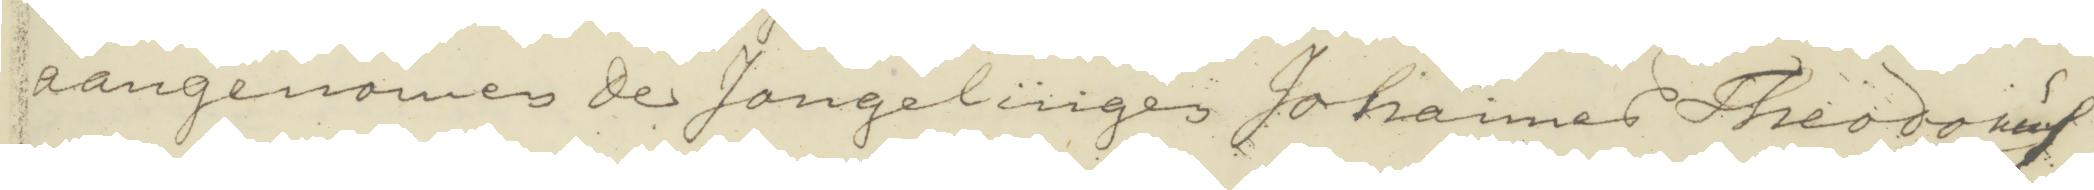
aangenomen de Jongelingen Johannes Theodorus
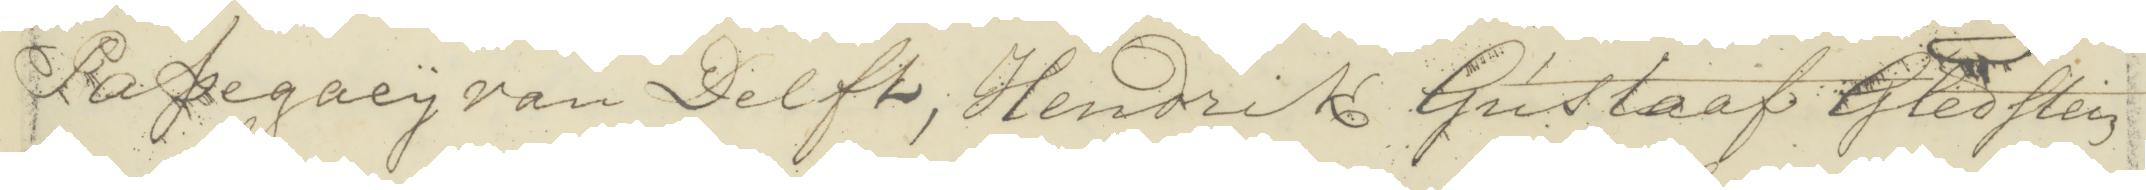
Papegaeij van Delft, Hendrik Gustaaf Gledstein
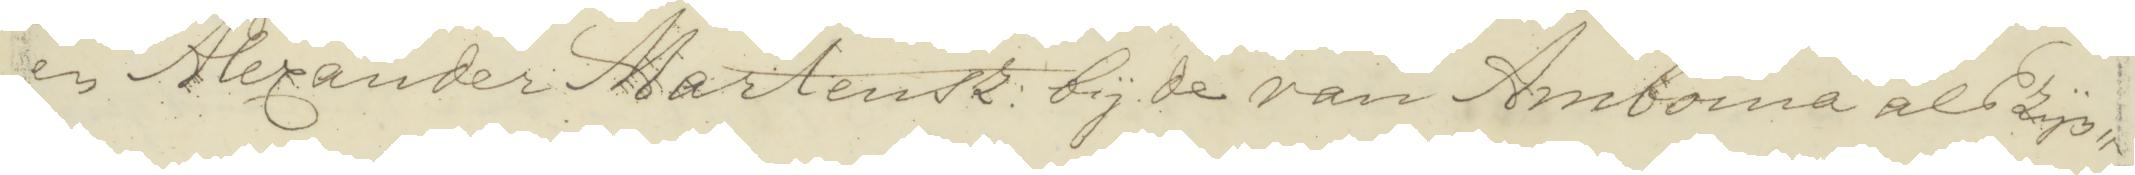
en Alexander Martensz: bijde van Amboina als zijn„
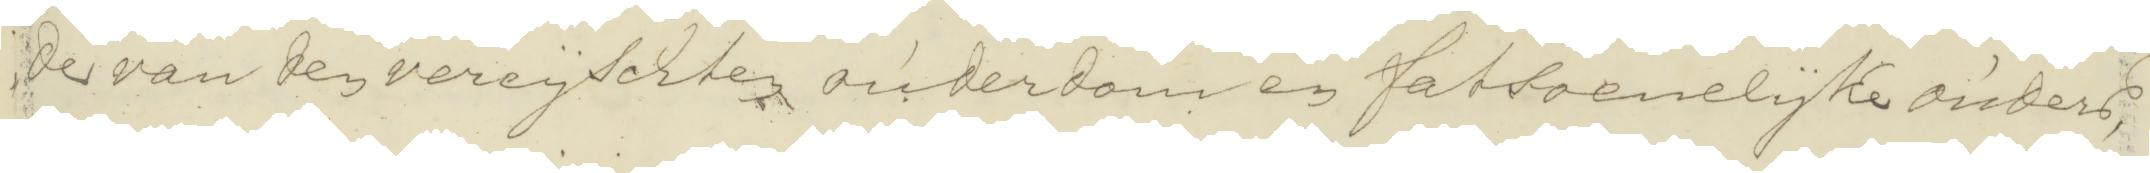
„de van den vereijschten ouderdom en fatsoenelijke ouders,
